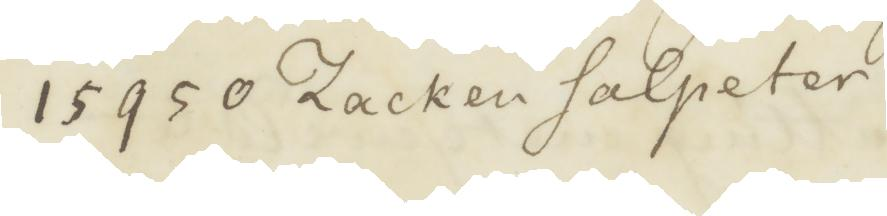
15950 zacken salpeter
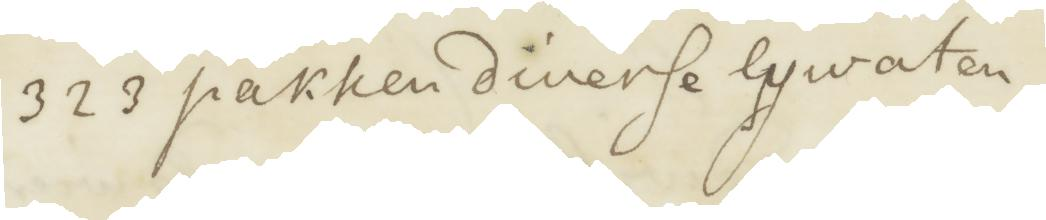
323 pakken diverse lywaten
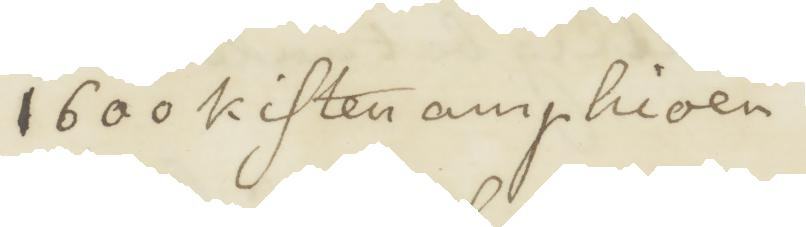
1600 kisten amphioen
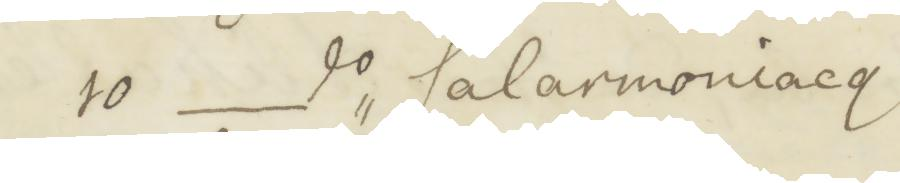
10 D„o salarmoniacq
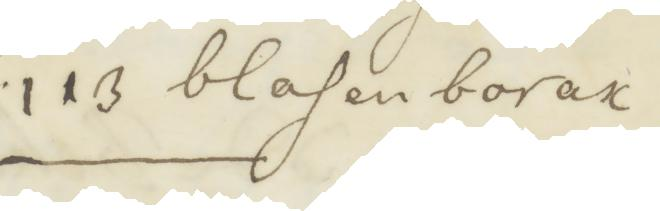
113 blasen borax
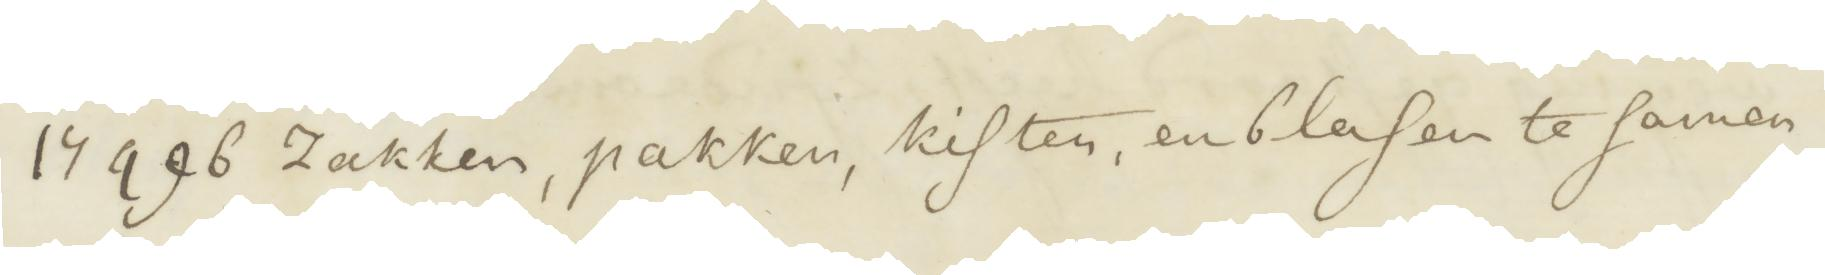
17496 zakken, pakken, kisten, en blasen te samen
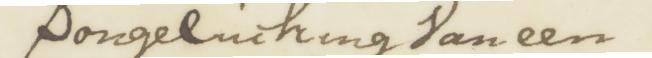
Verongelucking Van een
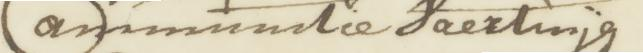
ammunitie vaertuijg
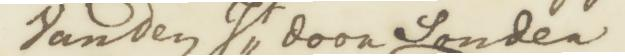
van den J„t door sonder
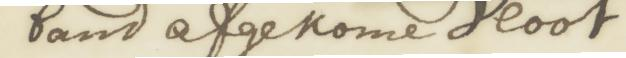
band afgekome Vloot
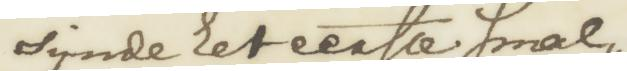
sijnde het eerste smal„
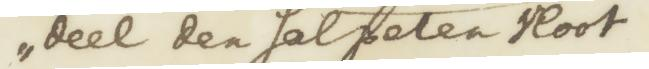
„deel der salpeter Vloot
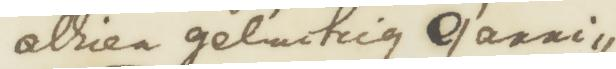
alhier geluckig G'arri„
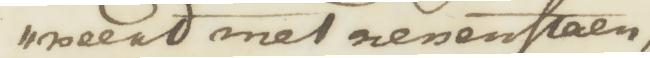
„veerd met nevenstaen„
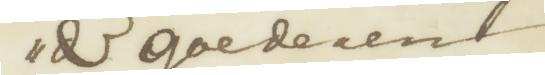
„de goederen
